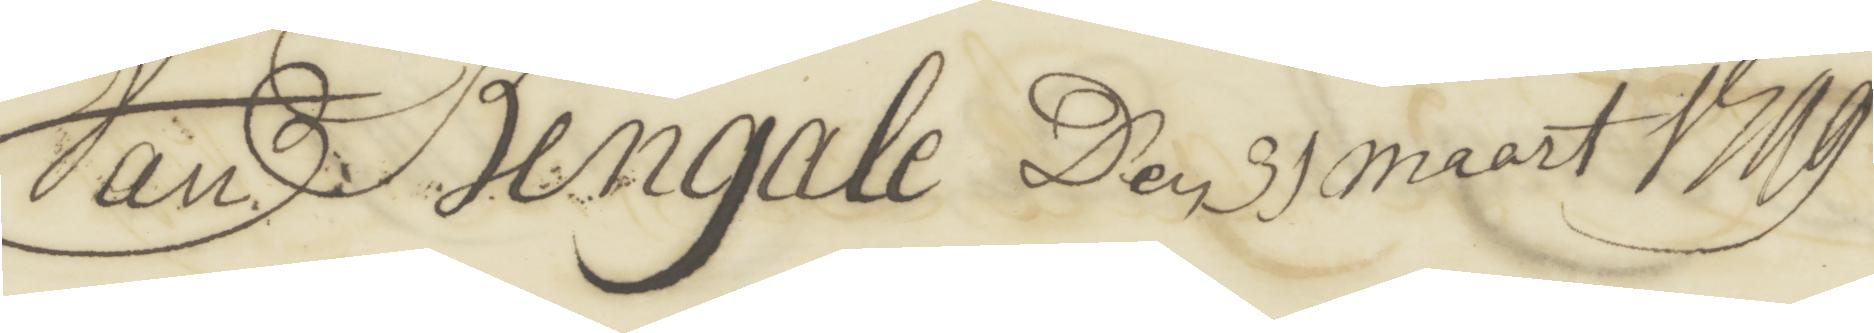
Van Bengale Den 31 maart 1749
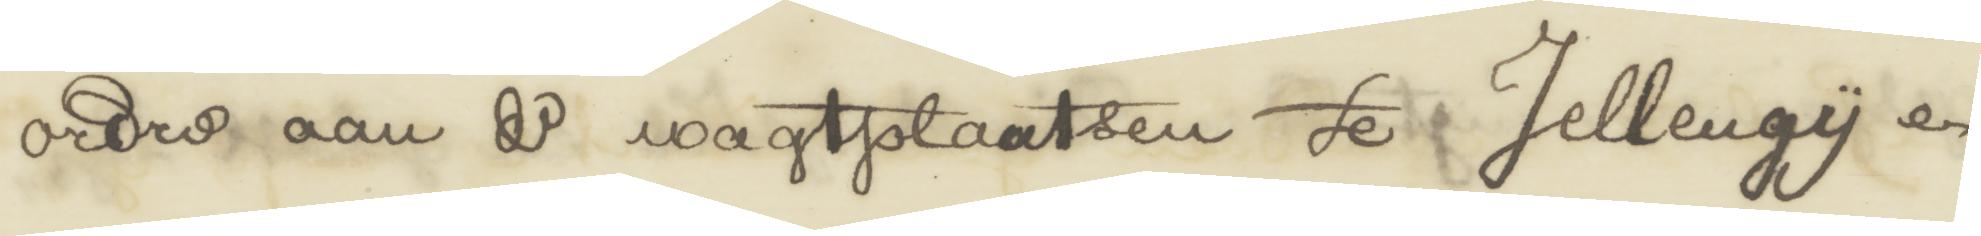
ordre aan de wagtplaatsen te Jellengij en
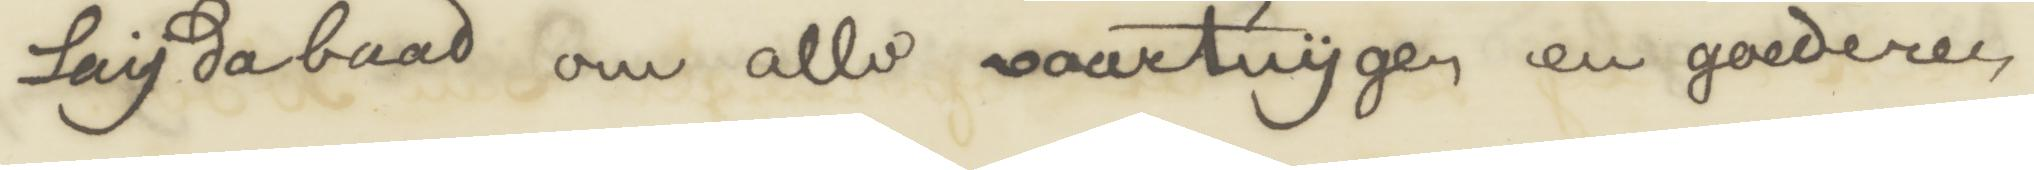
saijdabaad om alle vaartuijgen en goederen
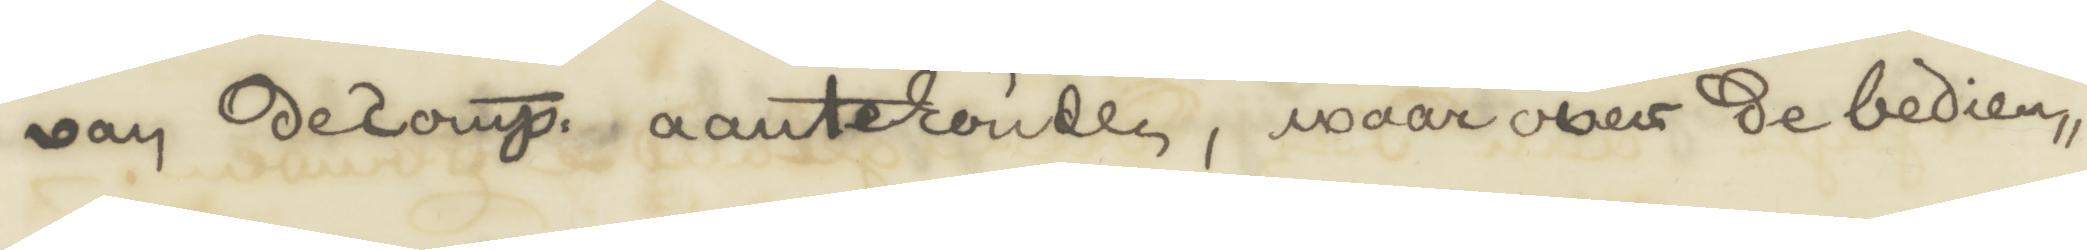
van de comp: aantehouden, waar over de bedien„
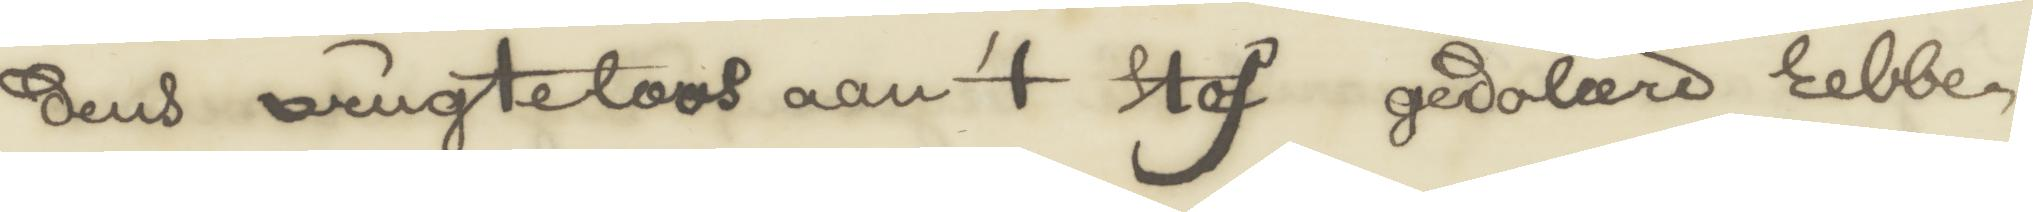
dens vrugteloos aan ’t stof gedoleerd hebben
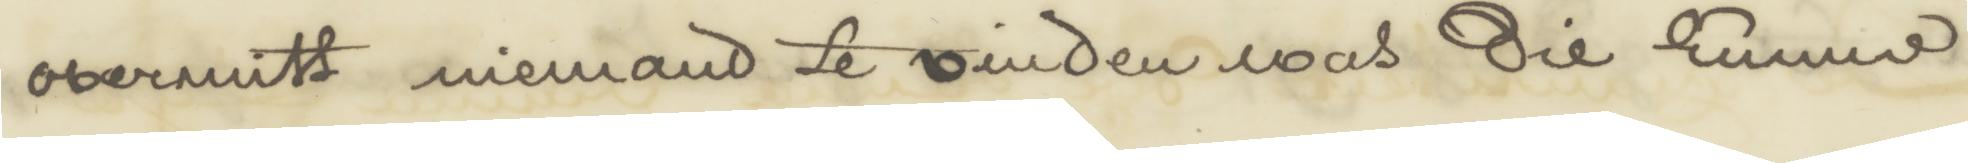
overmits niemand te vinden was die hunne
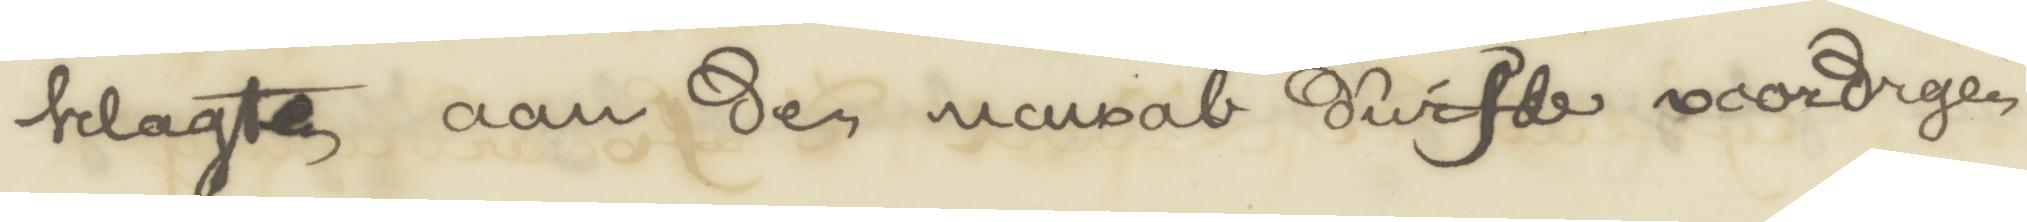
klagten aan den nawab durfde voordrgen
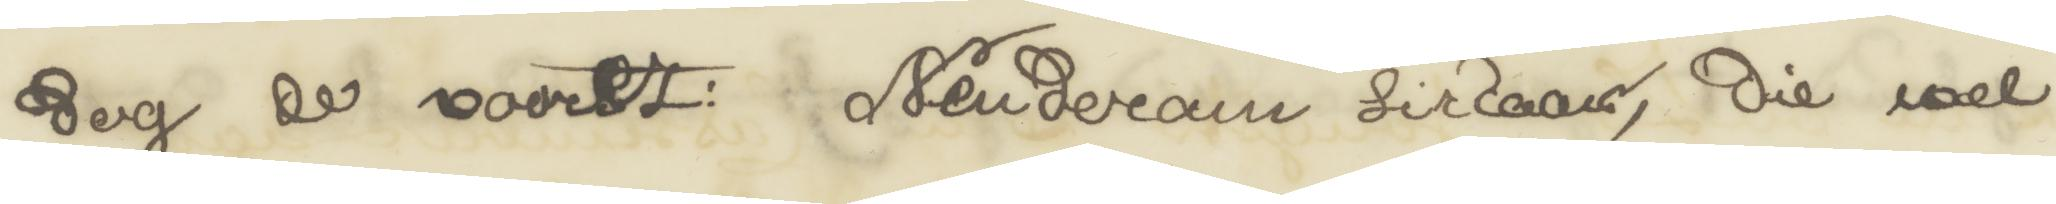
dog de voorsz: Nenderam sircaar, die wel
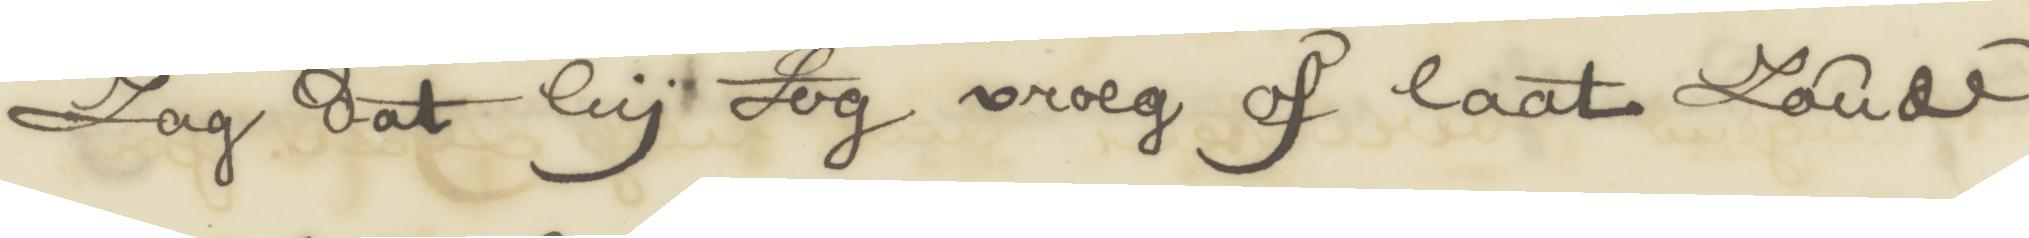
zag dat hij tog vroeg of laat zoude
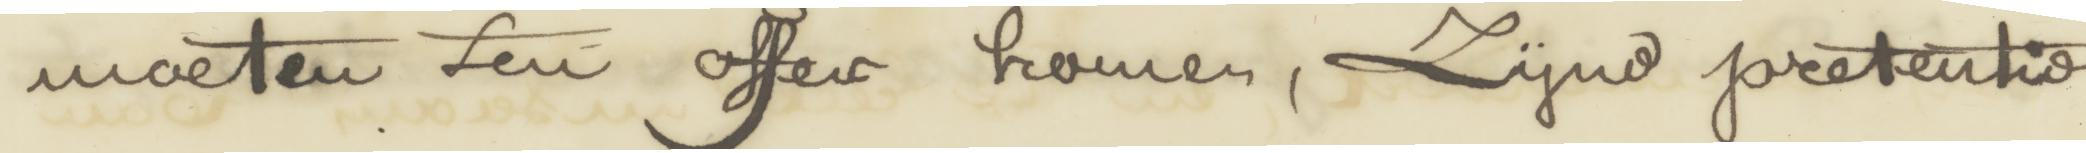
moeten ten offer komen, zijne pretentie
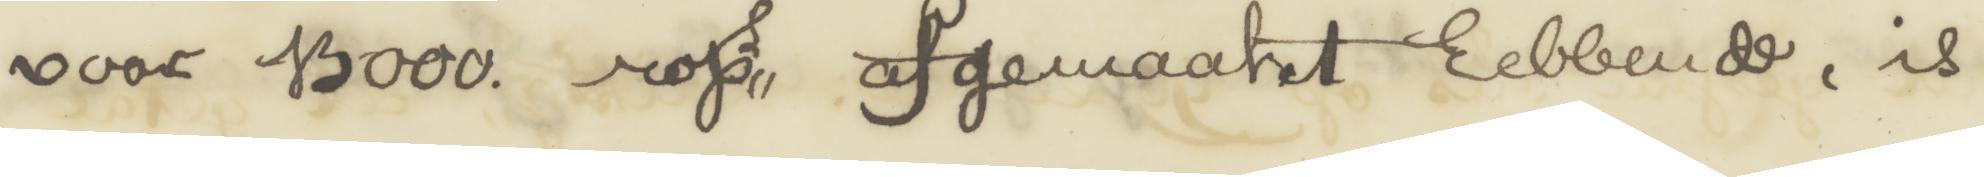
voor 13000. rop„s afgemaakt hebbende, is
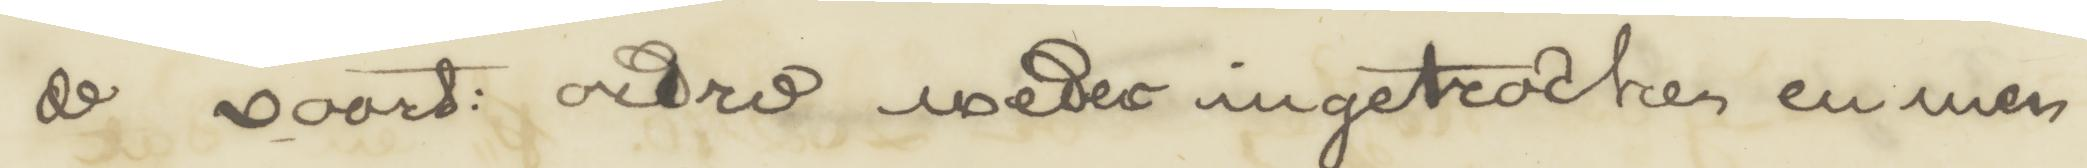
de voors: ordre weder ingetrocken en men
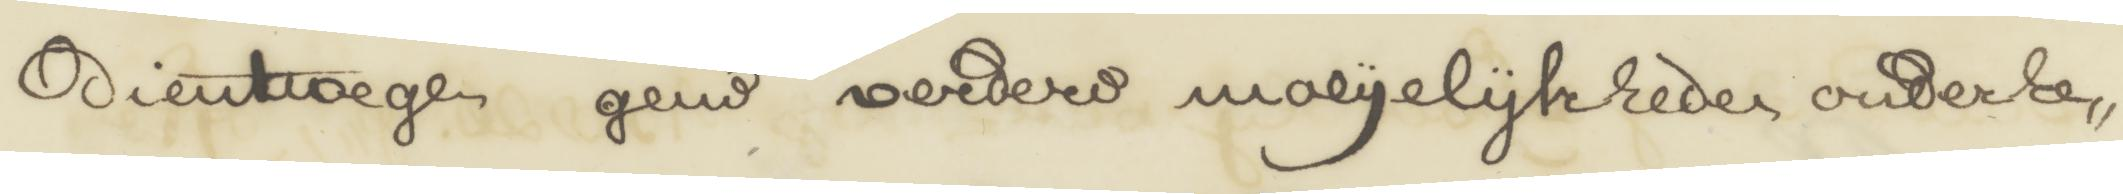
dientwegen gene verdere moeijelijkheden onderhe„
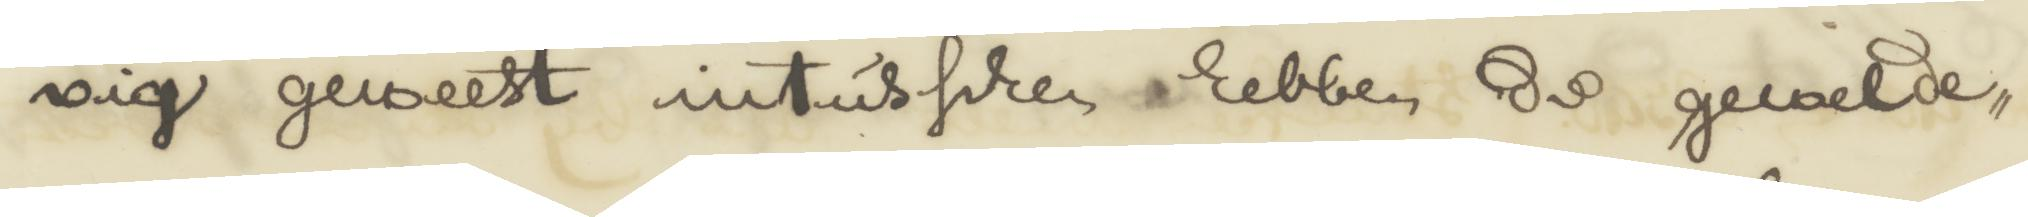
vig geweest intusschen hebben de gewelde„
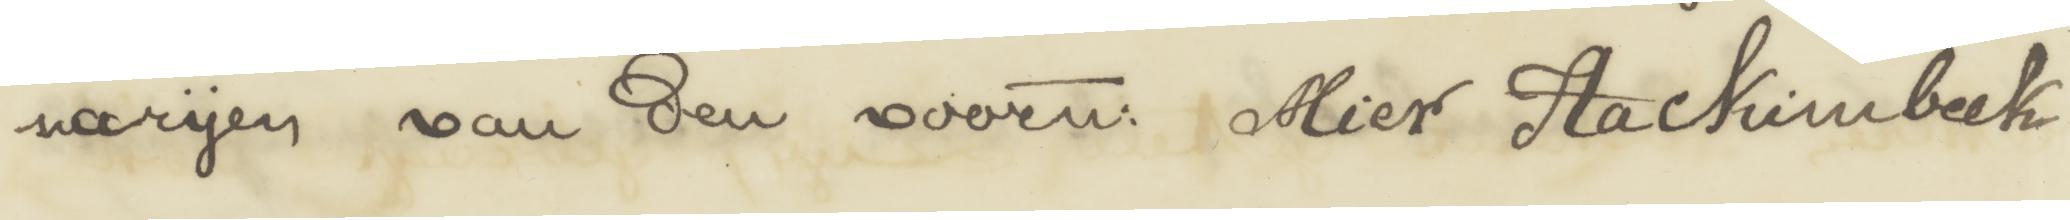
narijen van den voorn: Mier Stackimbeek
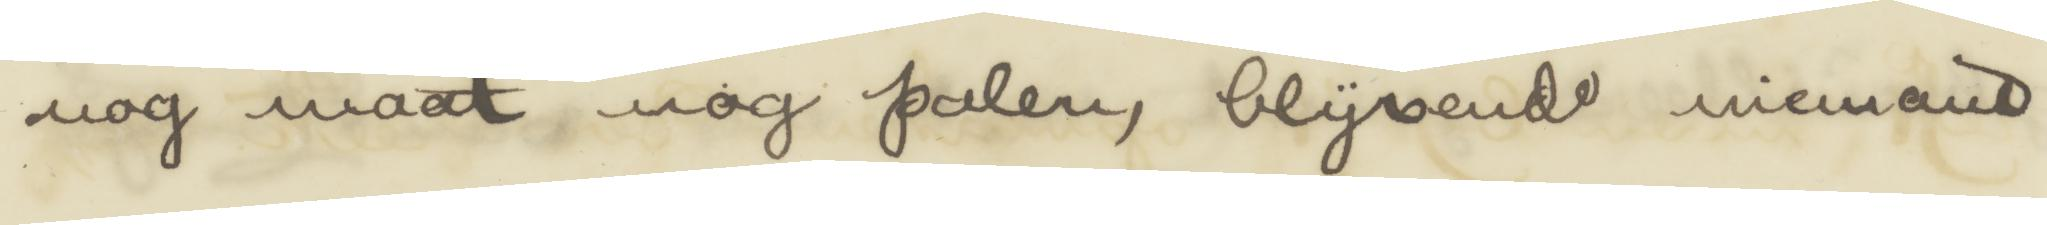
nog maat nog palen, blijvende niemand
